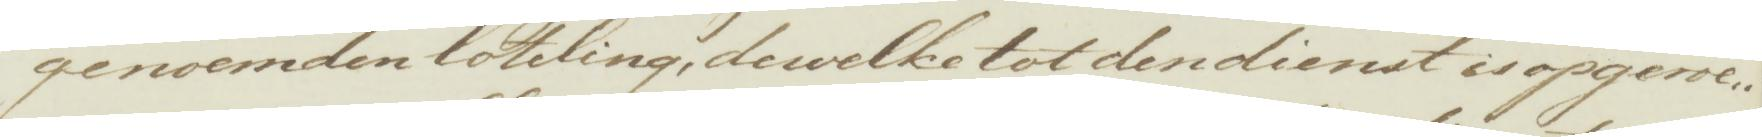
genoemden loteling, dewelke tot den dienst is opgeroe„
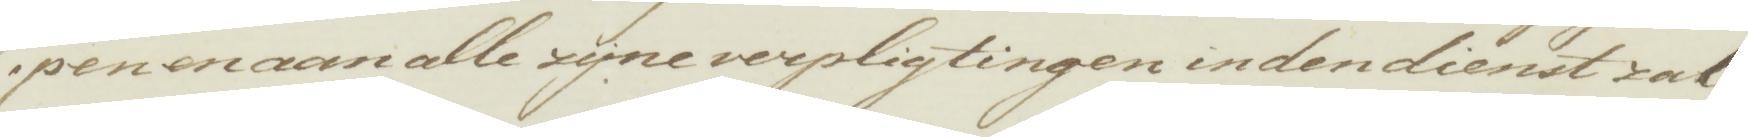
„pen en aan alle zijne verpligtingen in den dienst zal
